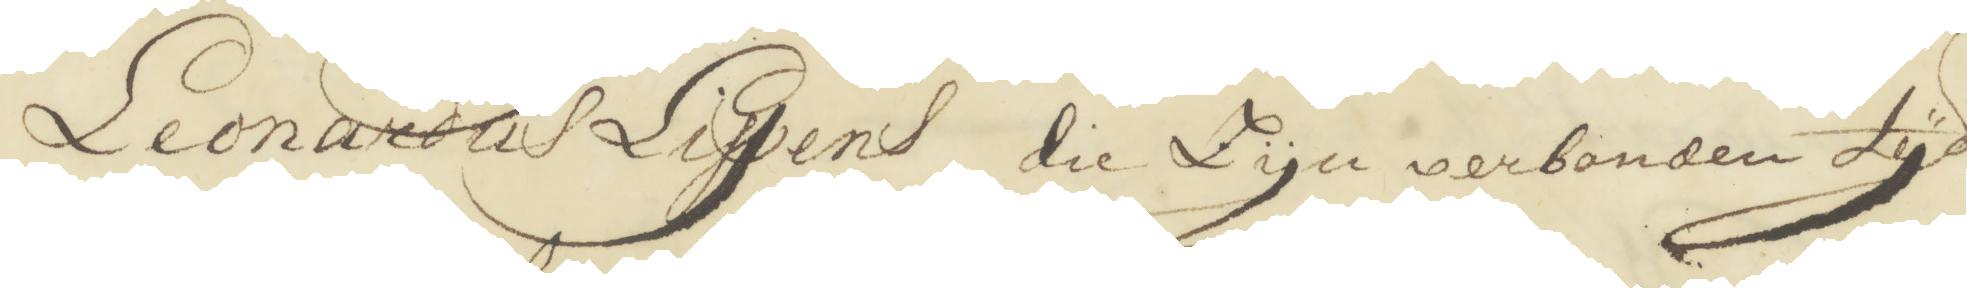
Leonardus Lippens, die zijn verbonden tijd
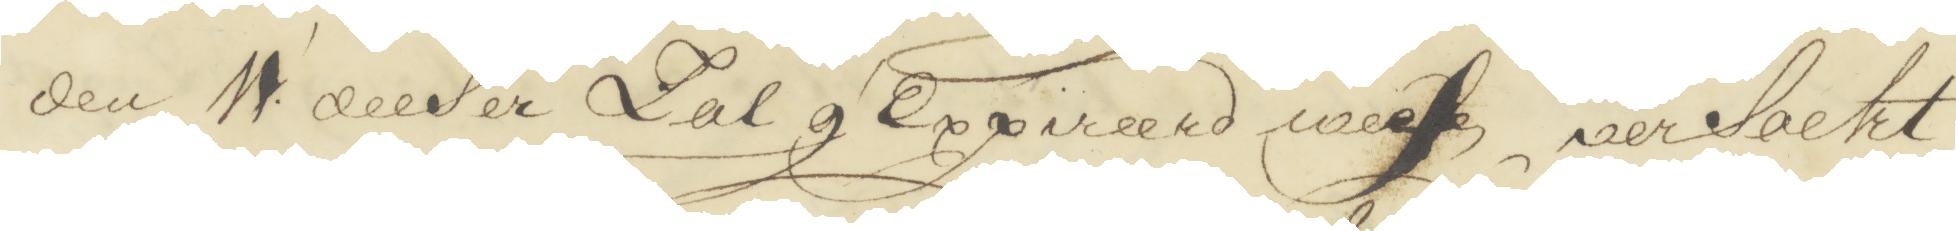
den 11.' deeser zal g’Expireerd weesen, versoekt
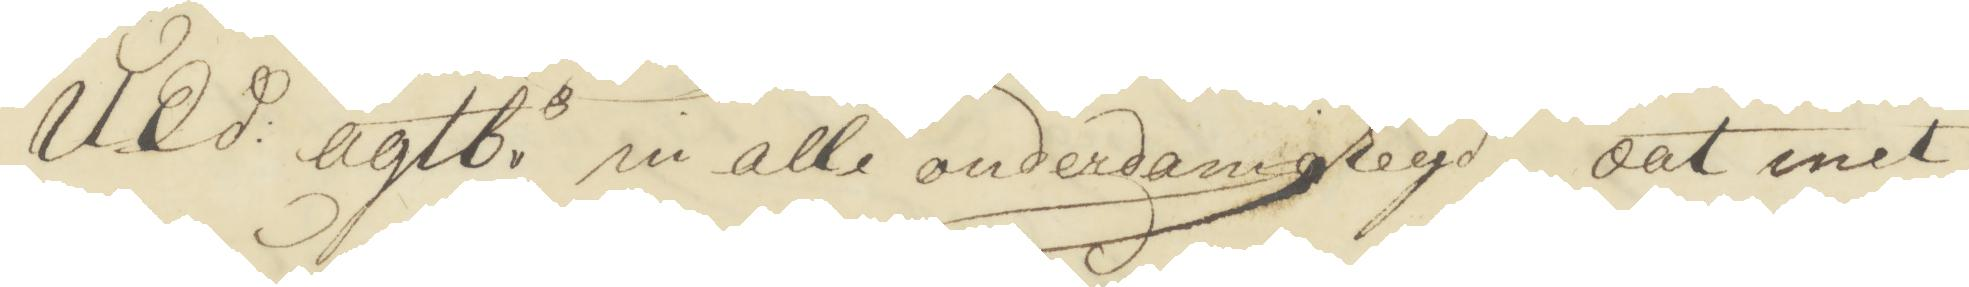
UEd: agtb„s in alle onderdanigheijd, dat met
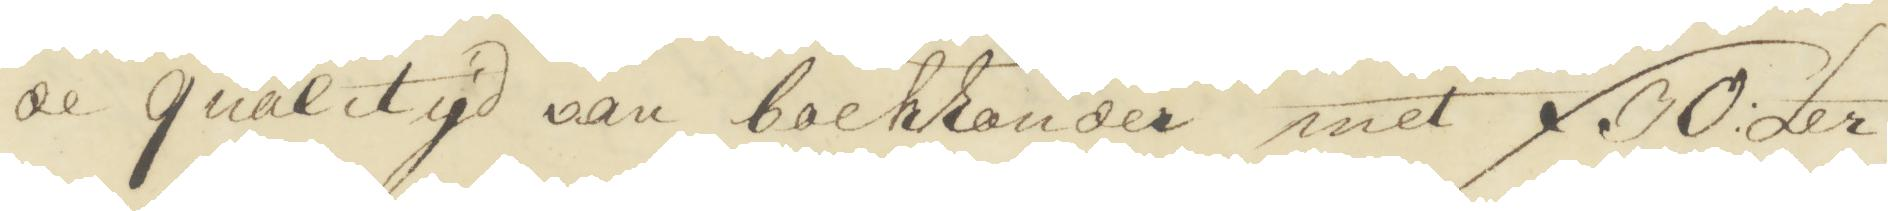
de qualitijd van boekhouder met ƒ30: ter
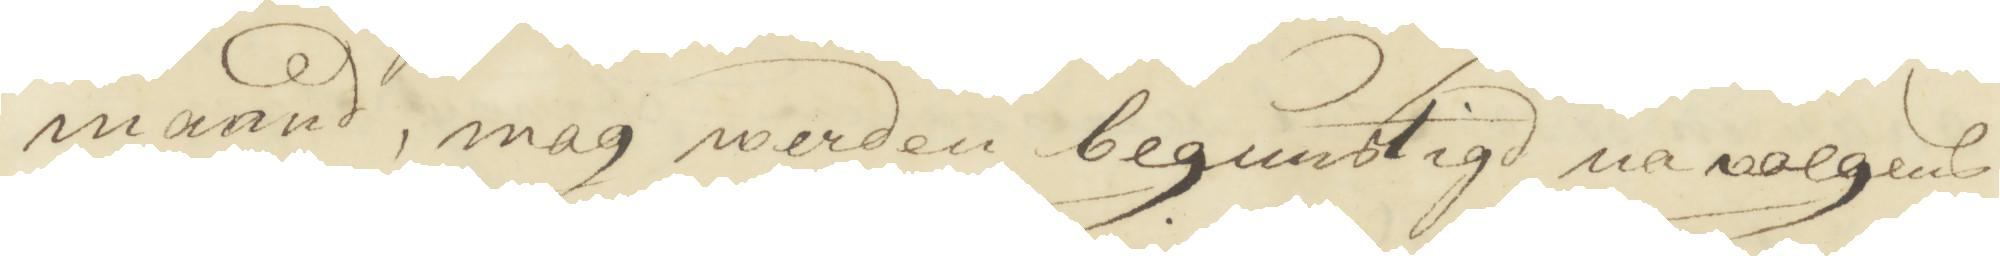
maand, mag werden begunstigd na volgens
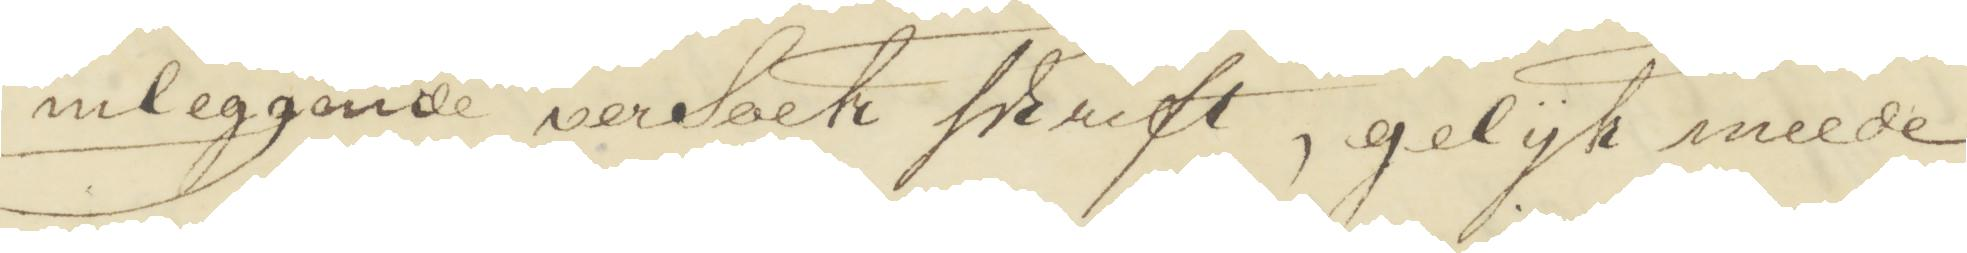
inleggende versoek schrift, gelijk meede
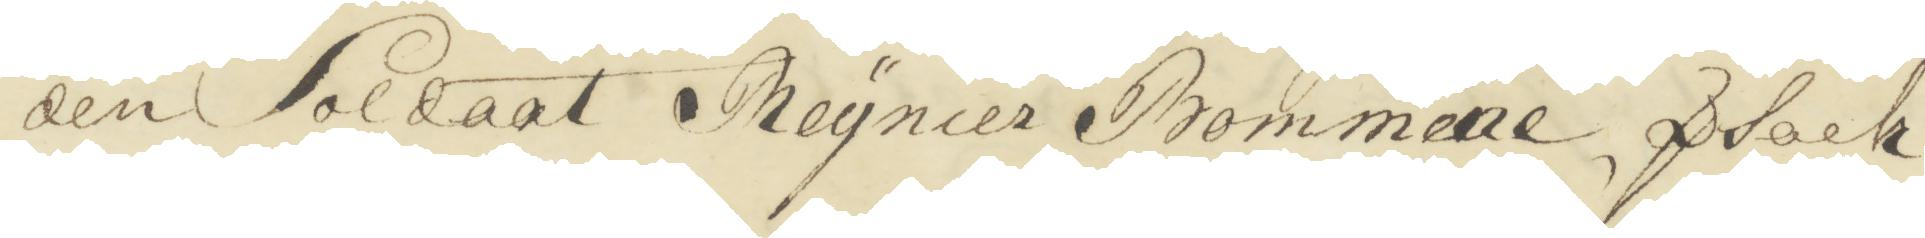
den Soldaat Reijnier Bommene, versoek
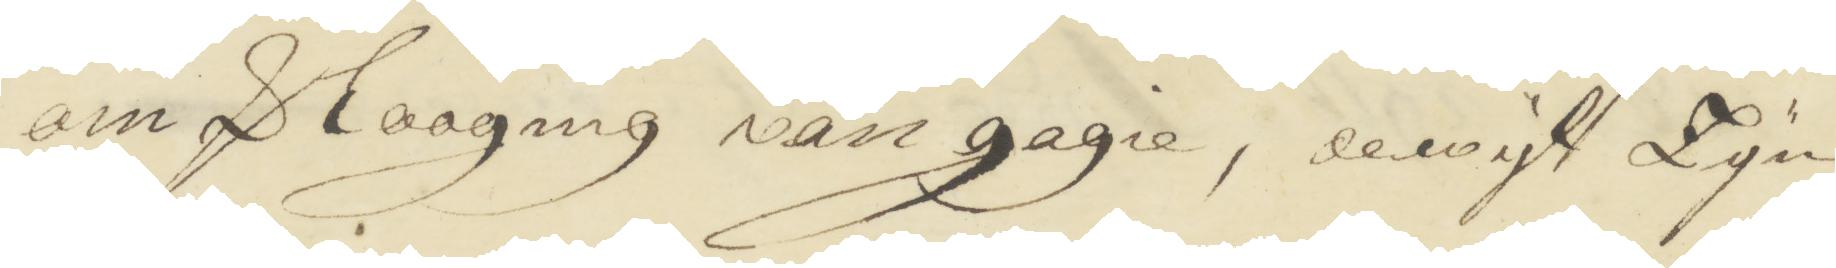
om verhooging van gagie, de wijl zijn
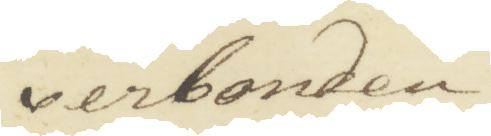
verbonden
